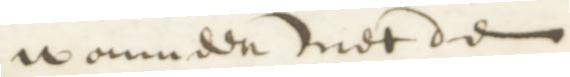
wanneer met de
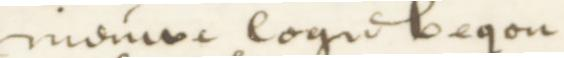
nieuwe logie begon
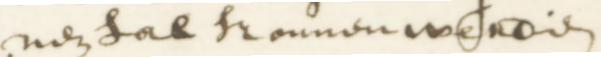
,nen sal konnen werden
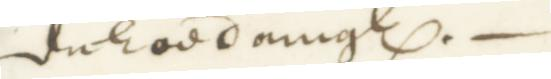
en hoe danigh.—
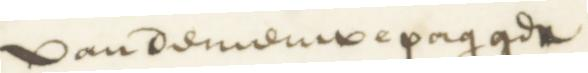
van de nieuwe pagger
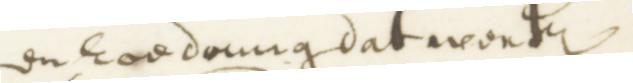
en hoe danig dat werk
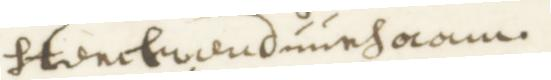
sterck en duursaam
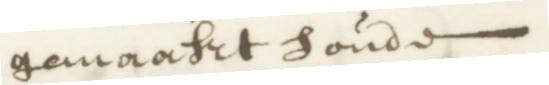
gemaakt soude
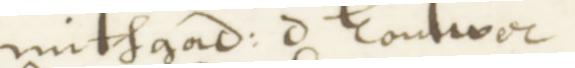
mitsgad:s d’ houtwer
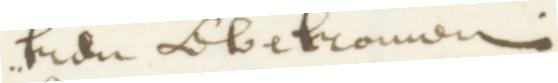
„ken te bekomen
